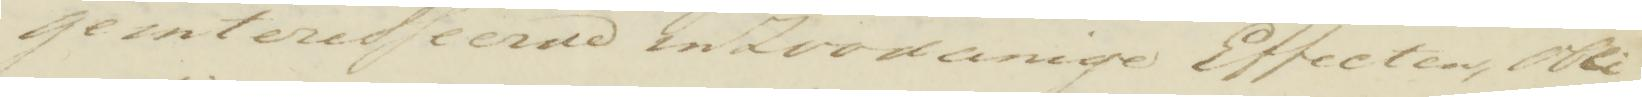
geinteresseerde in zoodanige Effecten, obli
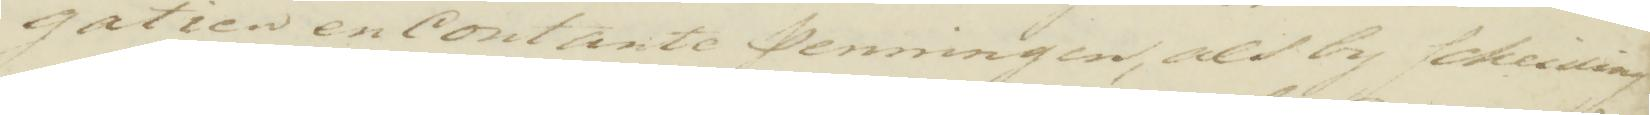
gatien en contante penningen, als by scheiding
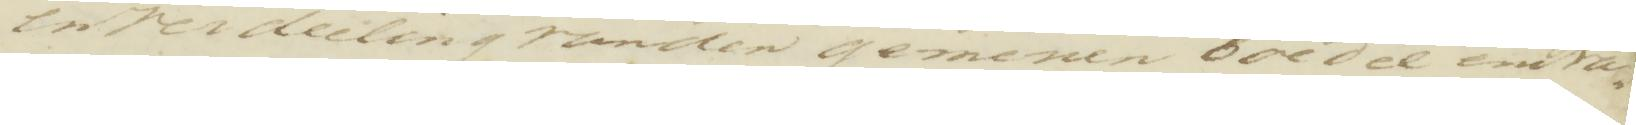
en verdeeling van den gemenen boedel en Na„
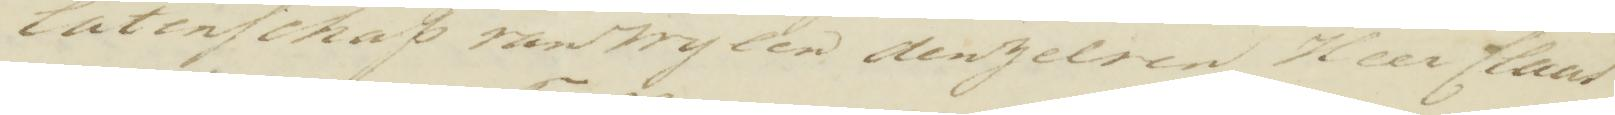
latenschap van wylen denzelven Heer Claas
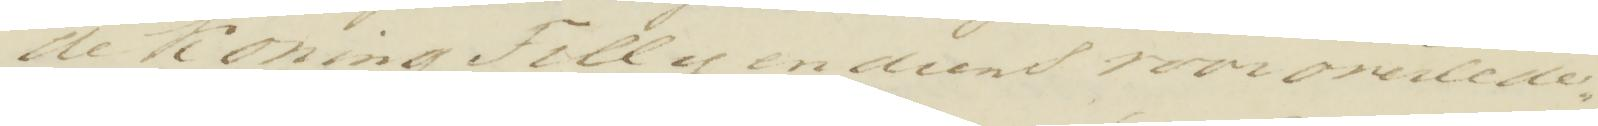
de Koning Tilly en diens voor overlede„
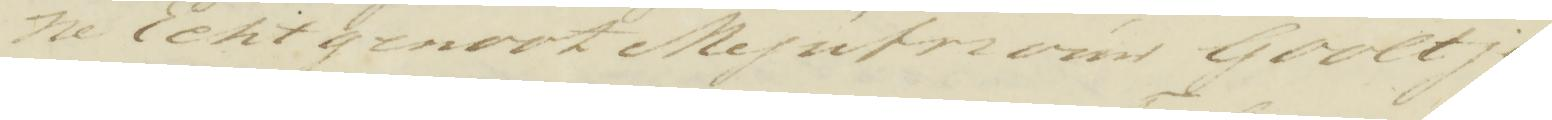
ne Echtgenoot Mejufvrouw Gooltje
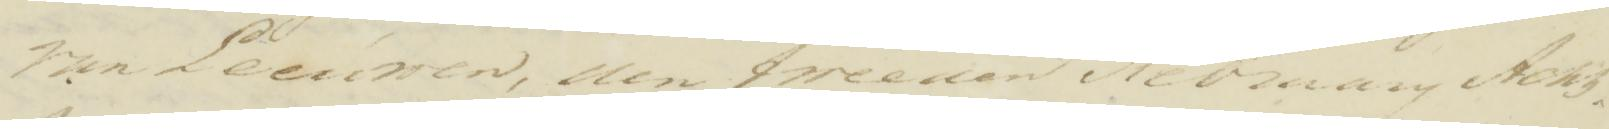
van Leeuwen, den tweeden February Acht„
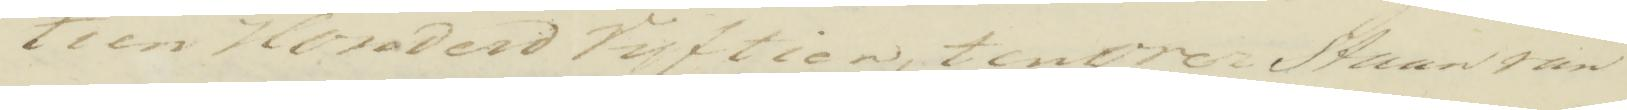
tien Honderd Vyftien, ten overstaan van
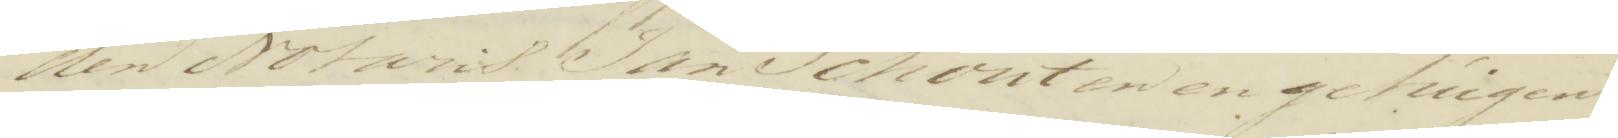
den Notaris Ian Schouten en getuigen
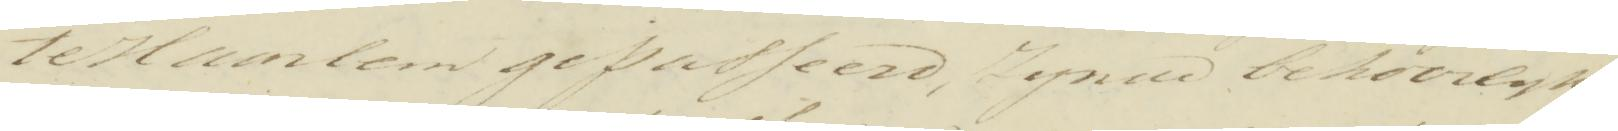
te Haarlem gepasseerd, zynde behoorlyk
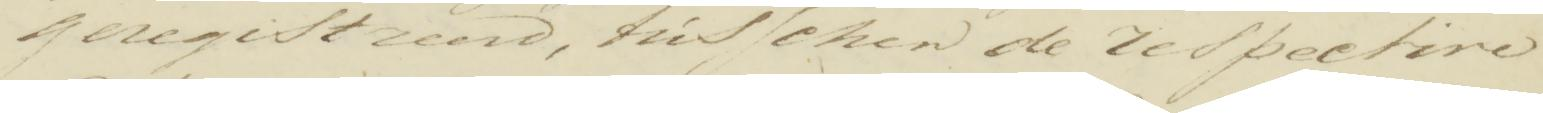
geregistreerd, tusschen de respective
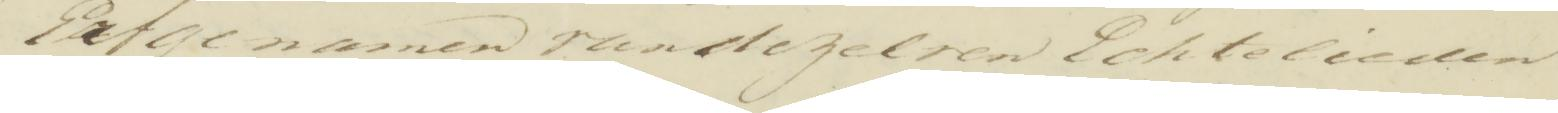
Erfgenamen van dezelven Echtelieden
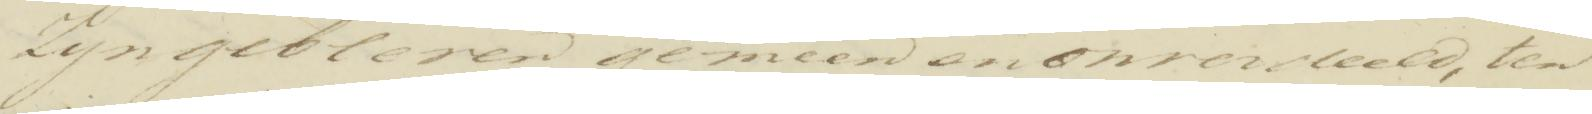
zyn gebleven gemeen en onverdeeld, ten
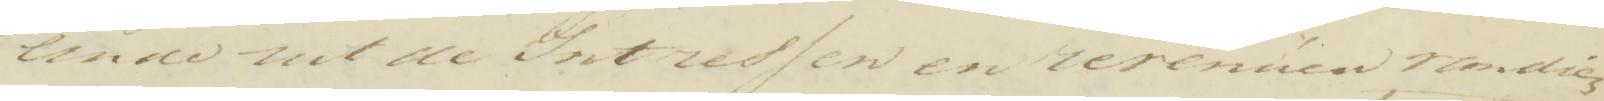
einde uit de Intressen en revenuën van dien
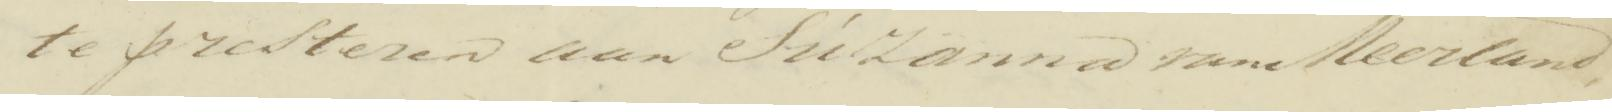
te presteren aan Suzanna van Meerland,
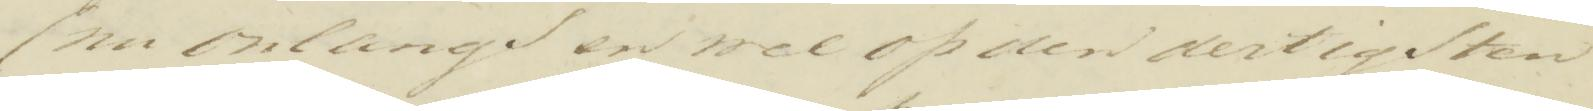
(nu onlangs en wel op den dertigsten
